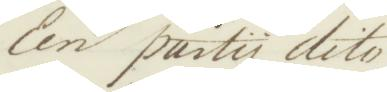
Een partij dito
